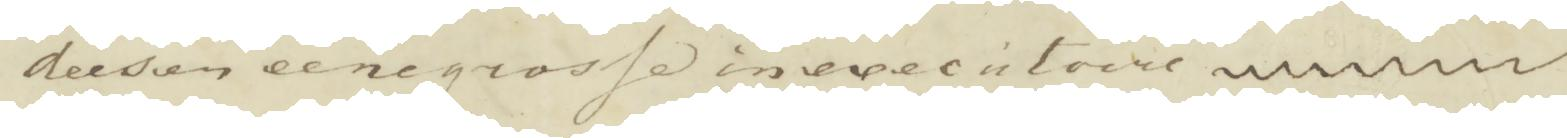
deesen eene grosse in executoire
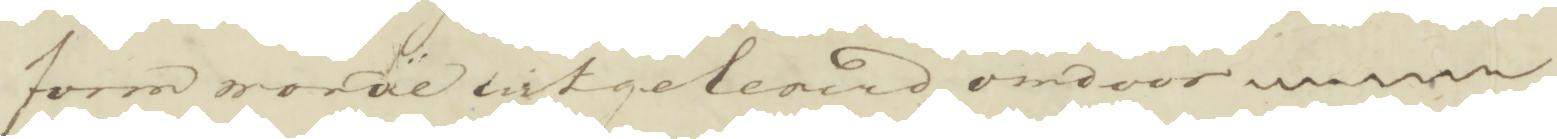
form worde uitgeleverd omdoor
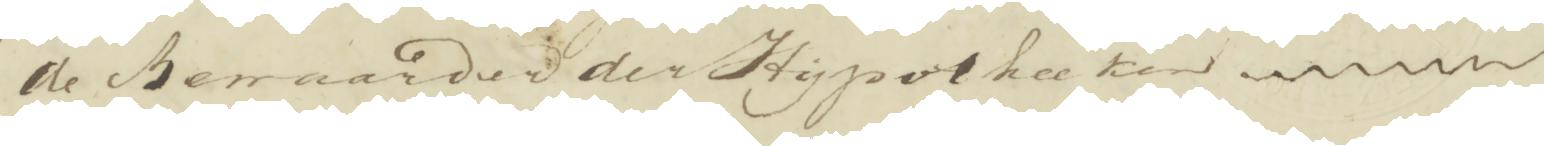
de Bewaarder der Hijpotheeken
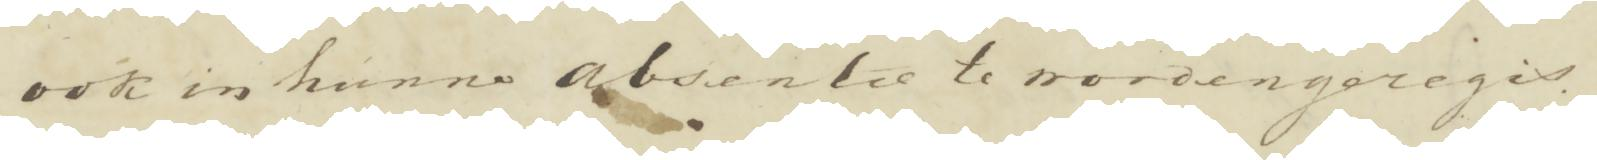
ook in hunne absentie te worden geregis„
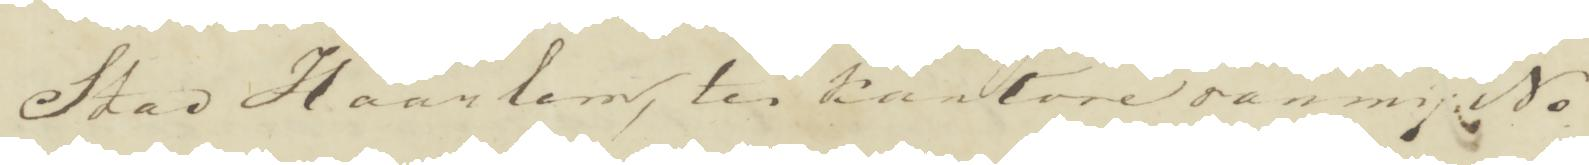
Stad Haarlem, ten kantore van my No
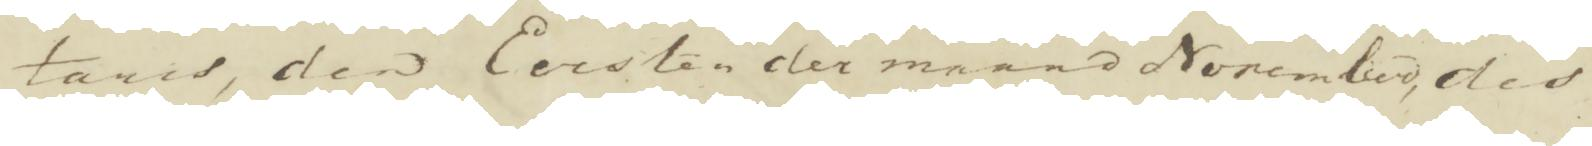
taris, den Eersten der maand November, des
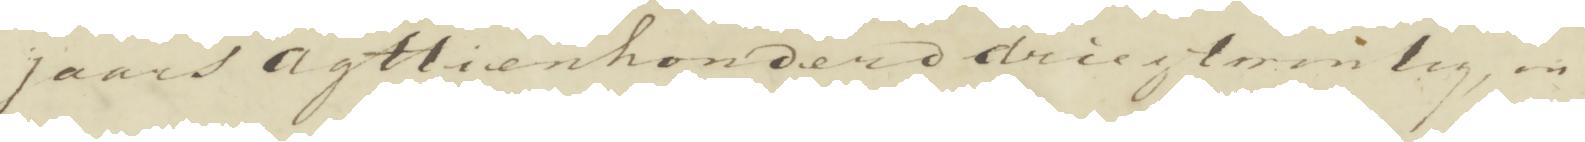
Jaars agttienhonderd drieen twintig, in
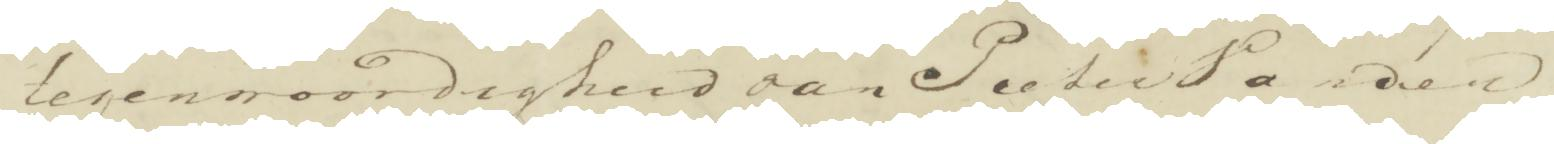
tegenwoordigheid van Pieter Van der
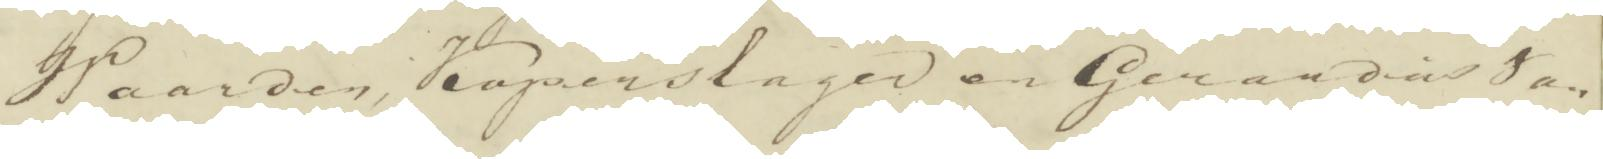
Waarden, Koperslager en Gerardus Van
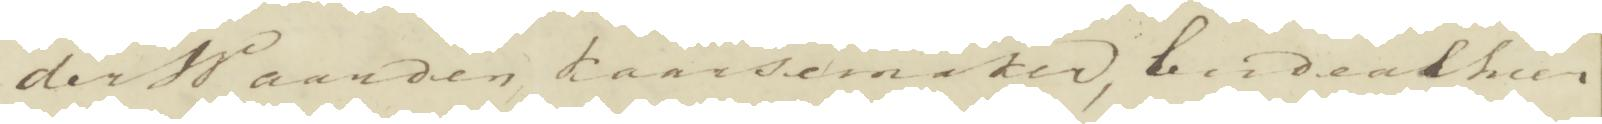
der Waarden, kaarsemaker, beide alhier
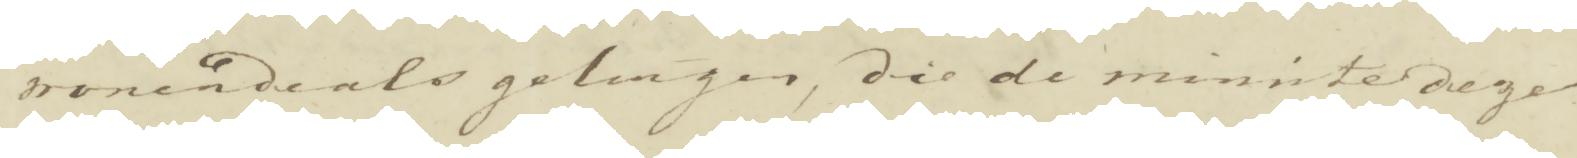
wonende als getuigen, die de minute deze
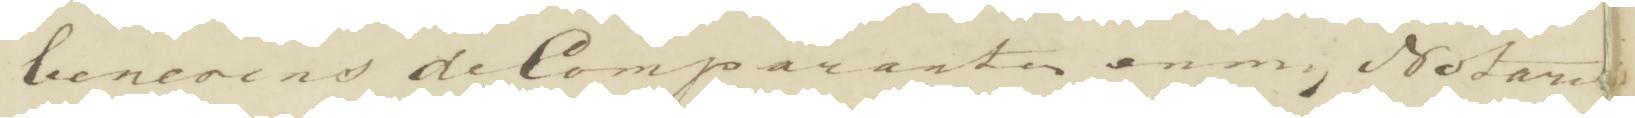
benevens de Comparanten en mij Notaris
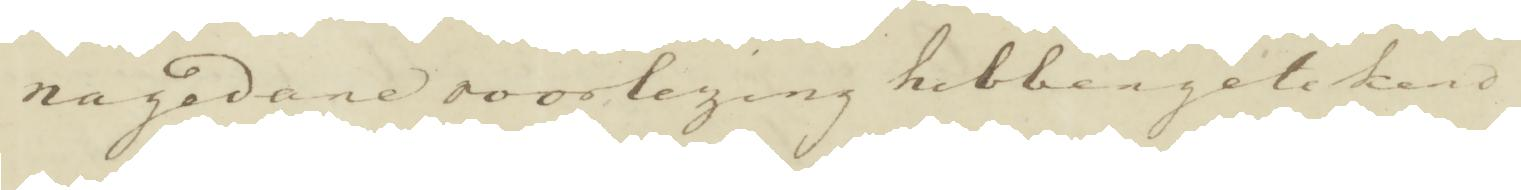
na gedane voorlezing hebben getekend
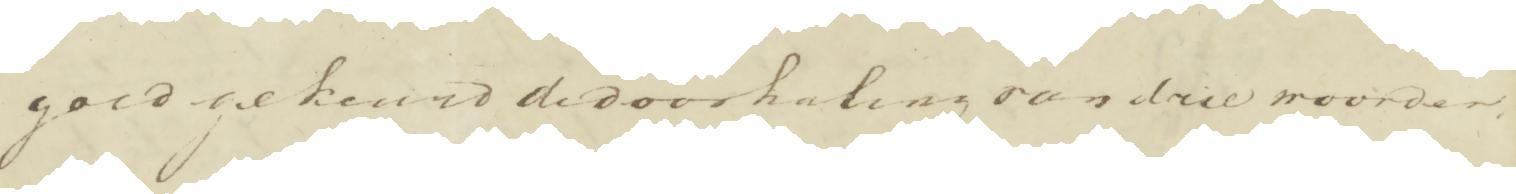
goed gekeurd de doorhaling van drie woorden
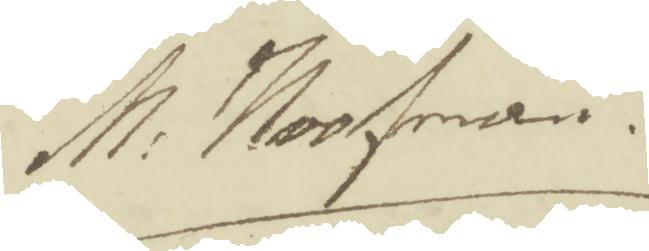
M: Hoofman.
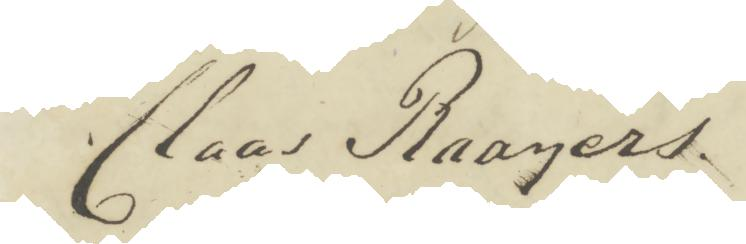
Caas Raayers
